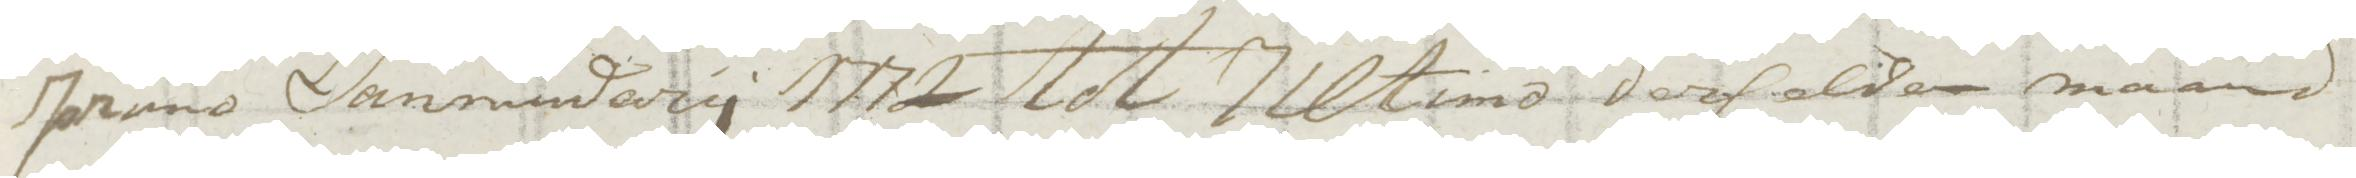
primo Iannuwarij 1772 tot ultimo derselven maand
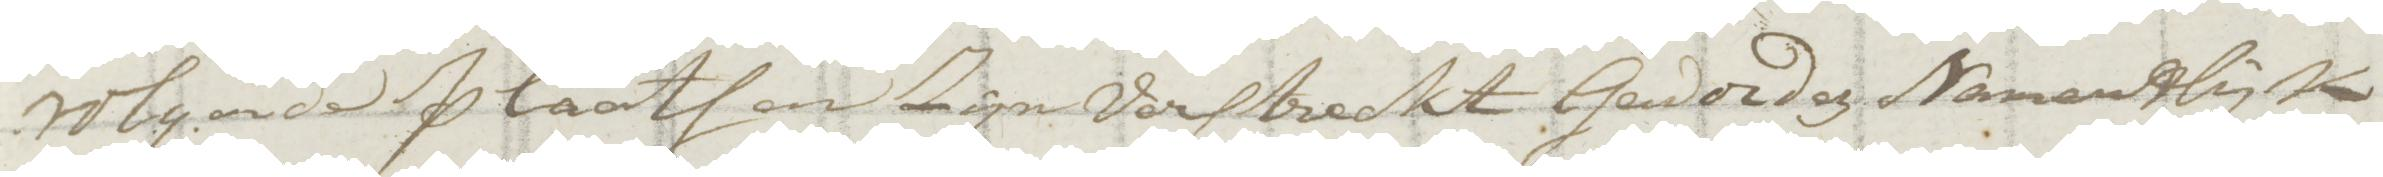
volgende plaatsen zijn verstreckt Geworden Namentlijk
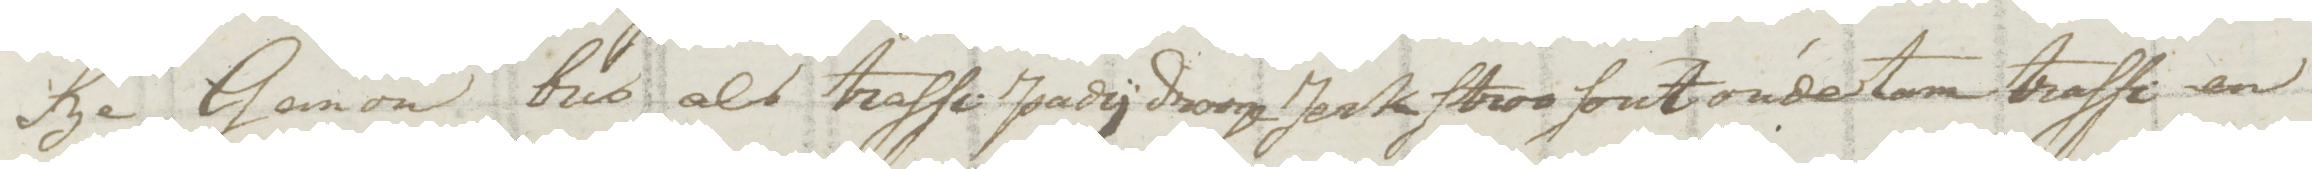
the Gemon bus als traffi padij drooge Jerk stroo sout oude tam traffi en
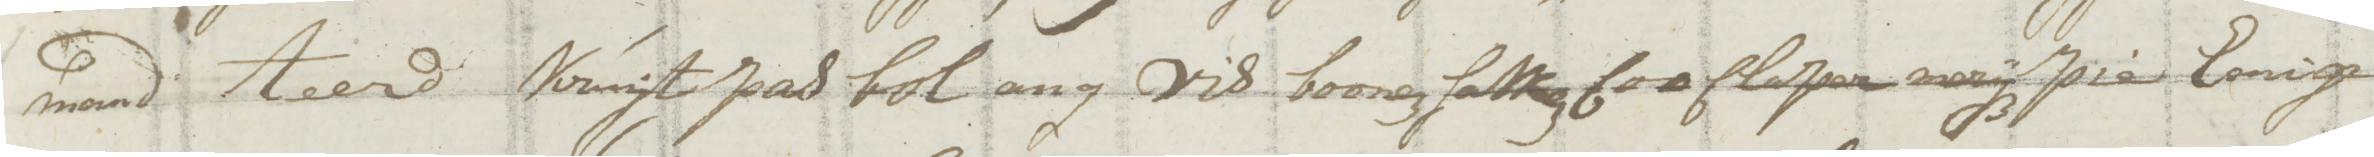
mand teerd kruijt pas bol ang vis boonen sakken Coo Claper merijn pie Eenige
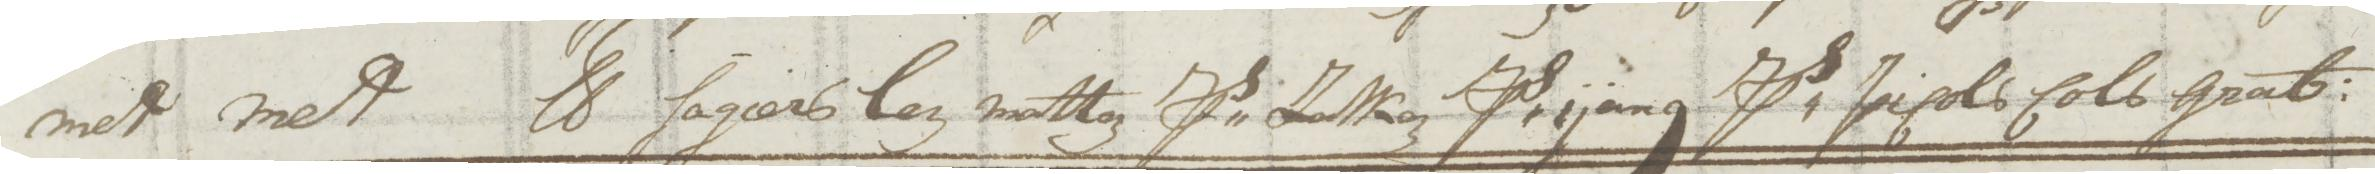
met met lb sagiers len matten p„s zakken p„s ijang p„s picols Cols Grab:
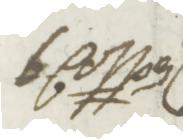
6 Coppen
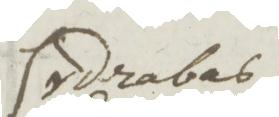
1 drabos
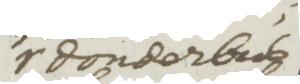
1 donderbus
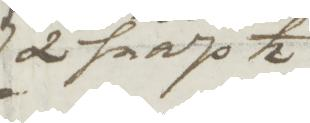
2 snaph
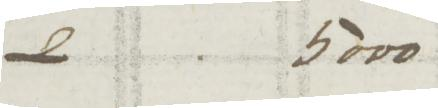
2 - 5000
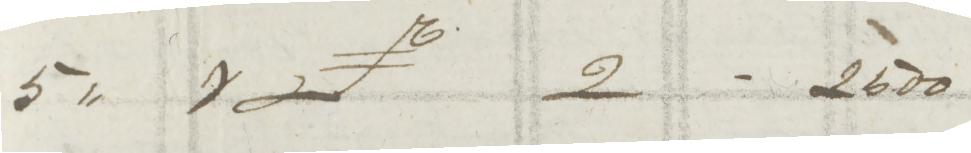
5 „ 1 D=o 2 - 2500
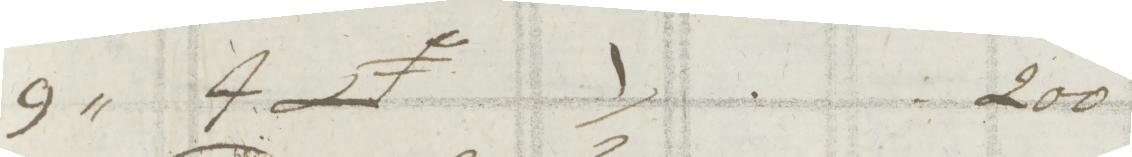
9 „ 4 D=o ½ - - 200
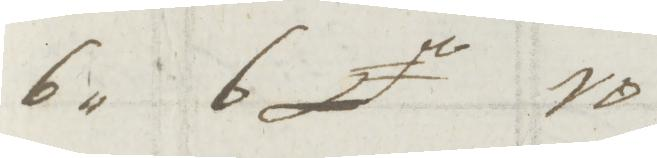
6 „ 6 D=o 10
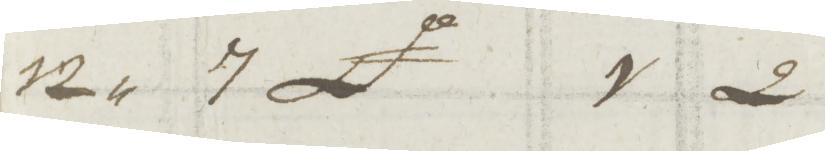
12 „ 7 D=o 1 2
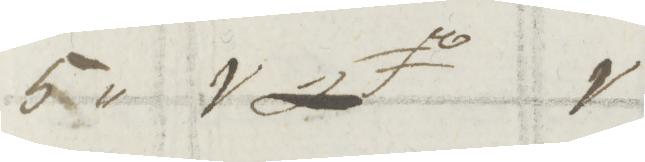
5 „ 1 D=o 1
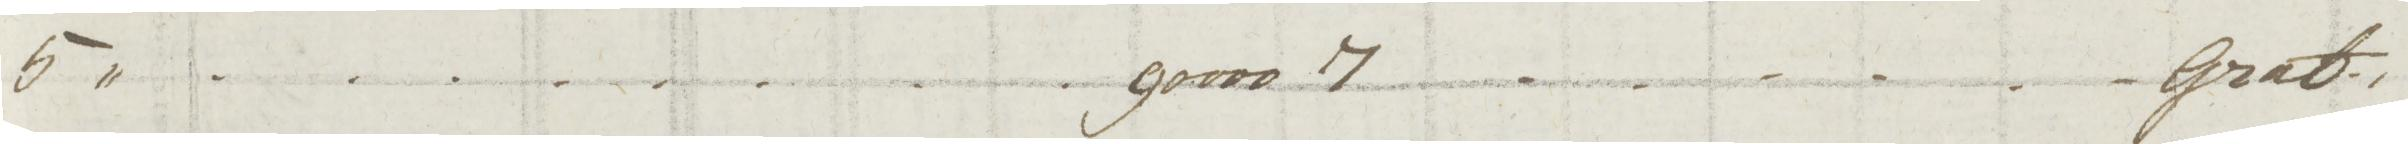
5 „ - - - - - - - - 90000 7 - - - - - - Grab.
